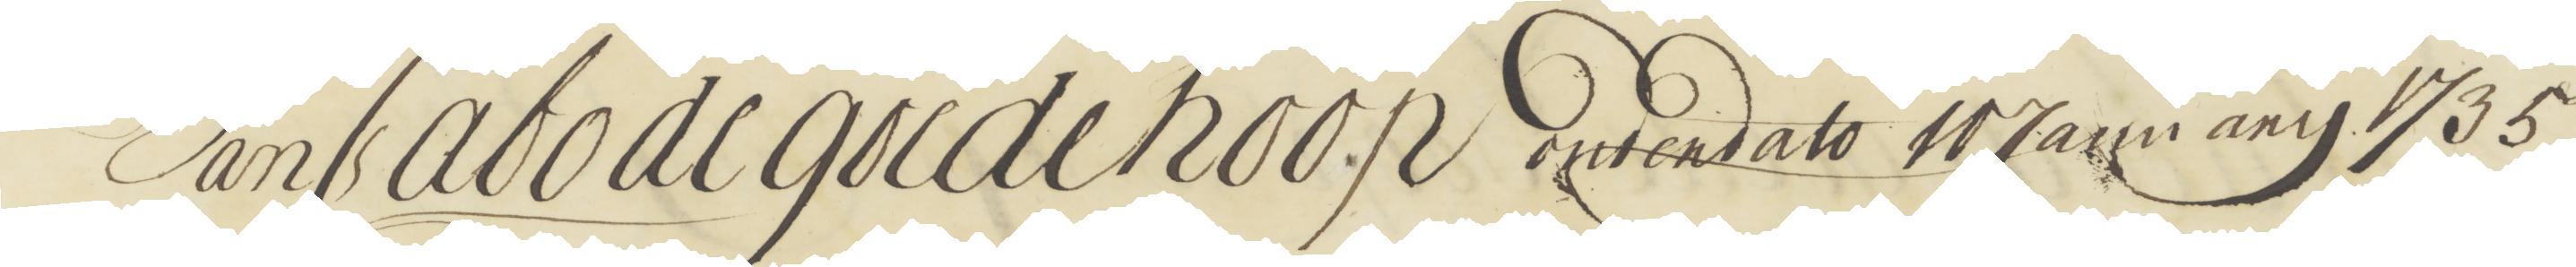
Van Cabo de goede hoop onder dato 10 Januarij 1735
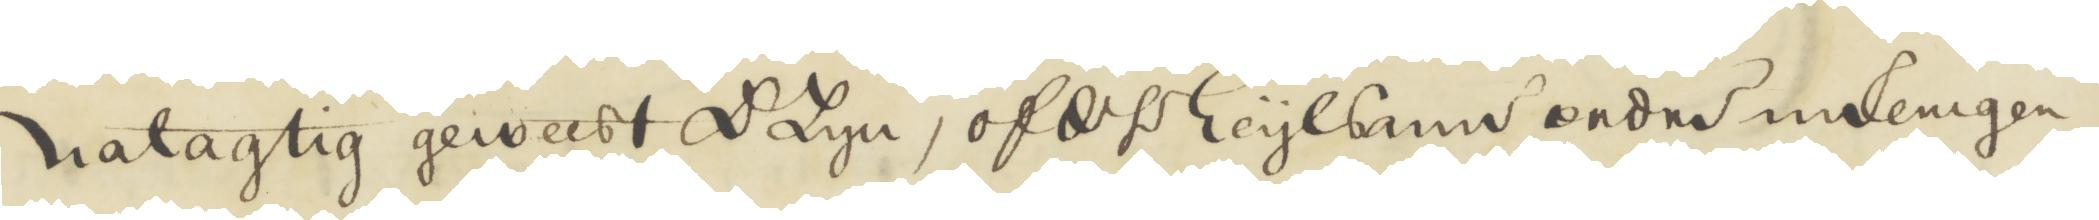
nalagtig geweest te zyn, of dese heijlsame ordre in Eenigen
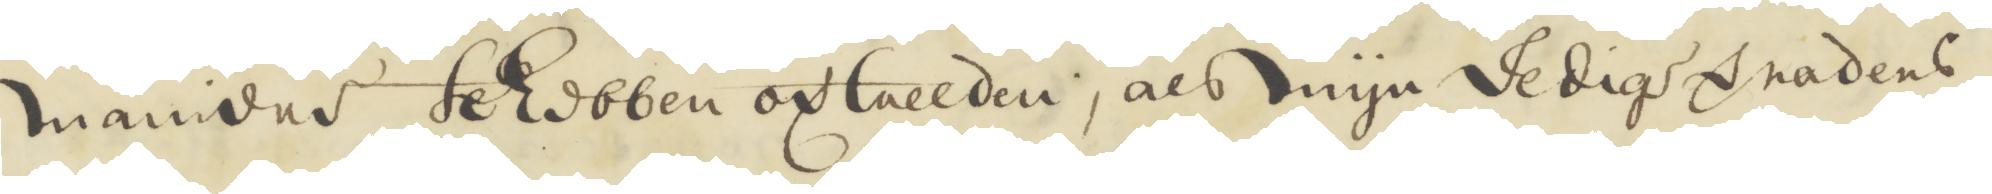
maniere tehebben overtreeden, als mijn Eedige verraders
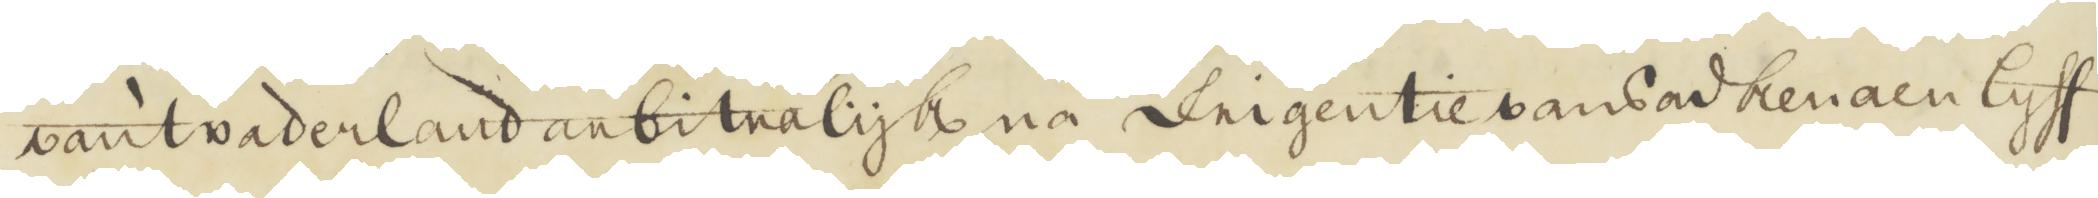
van’t vaderland arbitralijk na Erigentie vansaeken aen lyff
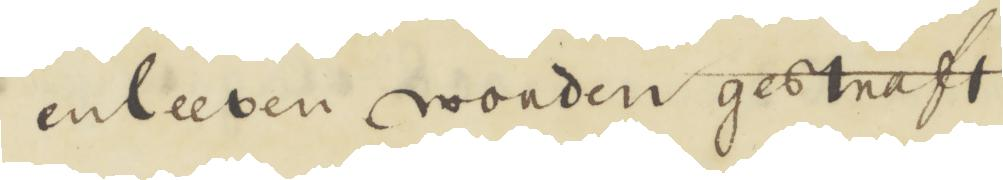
en leeven worden gestraft
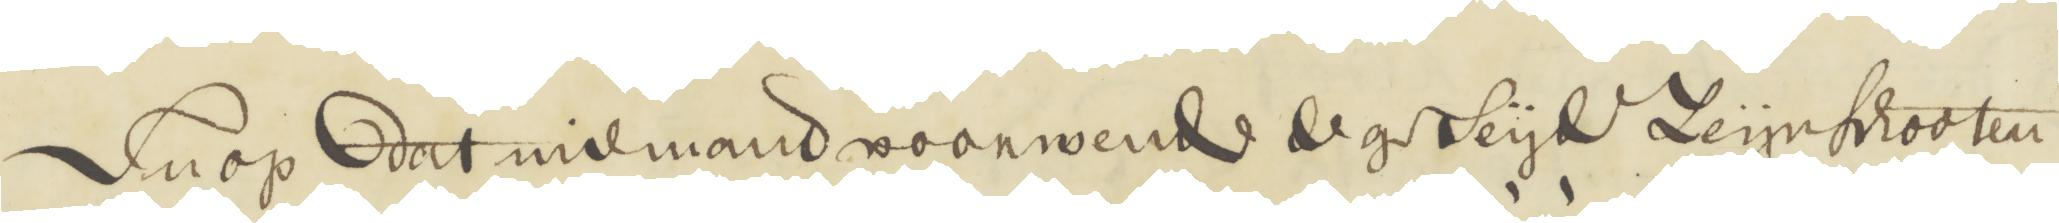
En op dat niemand voorwende de geseijde zeijn schooten
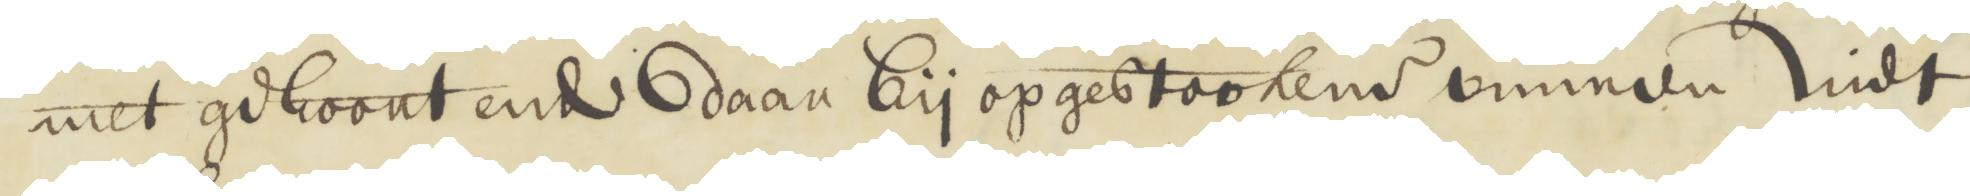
niet gehoort ende daar bij op gestookene vuuren niet
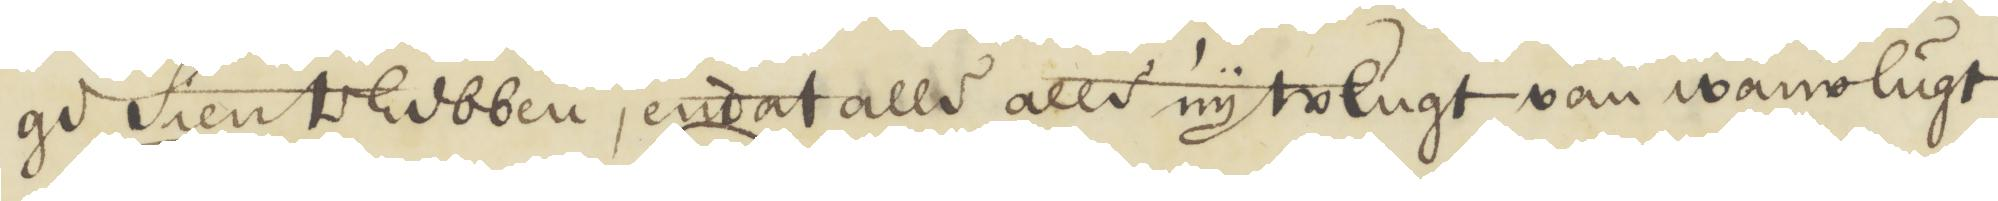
gesien te hebben, en dat alle alle uijtvlugt van wanvlugt
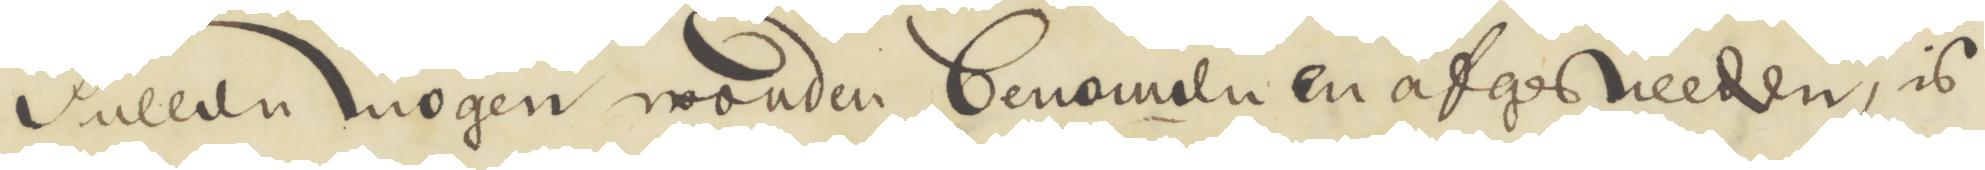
sullen mogen worden benomen en afgesneeden, is
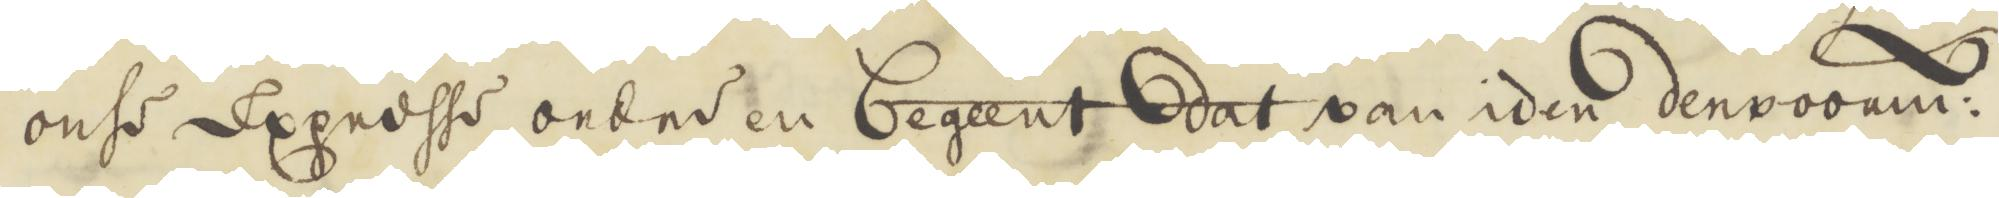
onse Expresse ordre en begeert dat van ider der voorm:
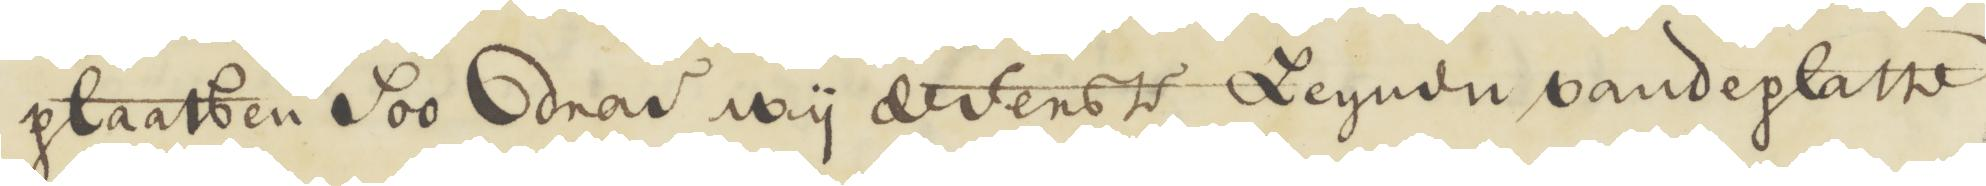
plaatsen soo drae wij de Eerste zeynen van de platte
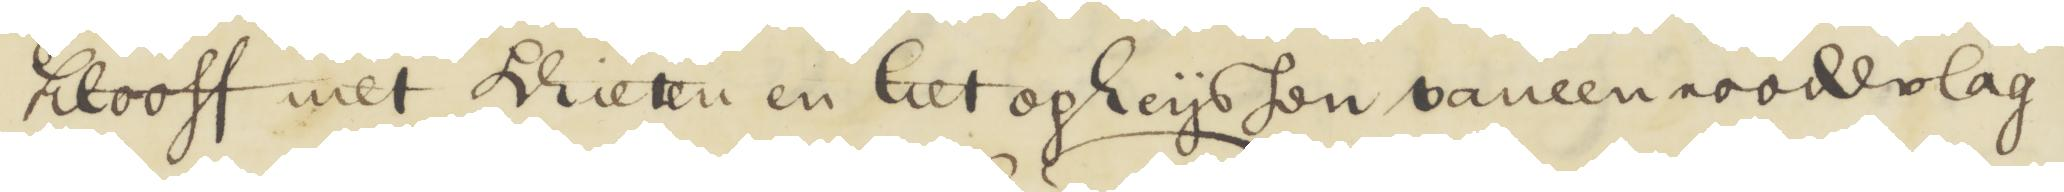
klooff met schieten en het opheijssen van een roode vlag
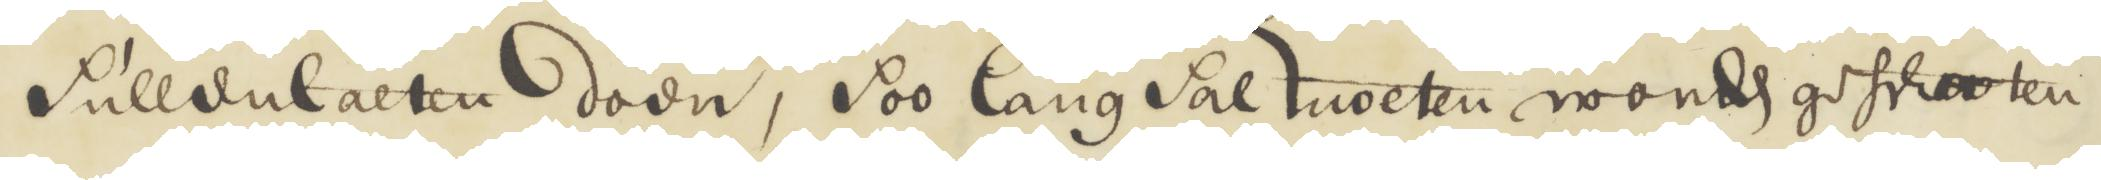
sullen laeten doen, soo lang sal moeten wonden geschooten
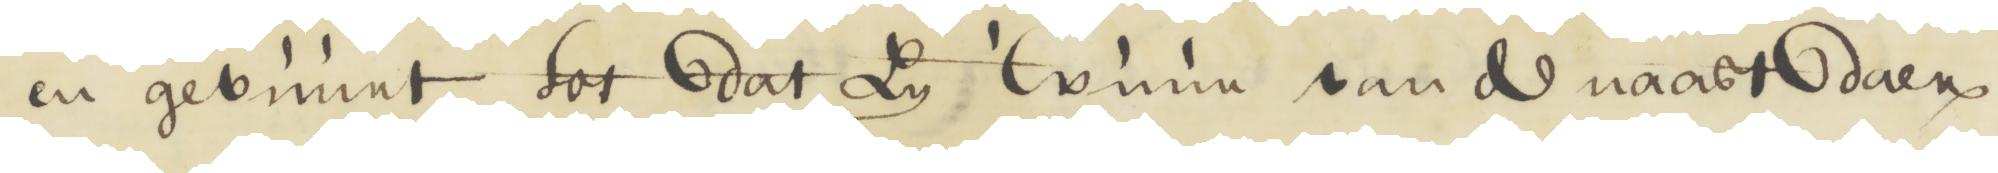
en gevuurt tot dat zy 't vuur van de naast daer
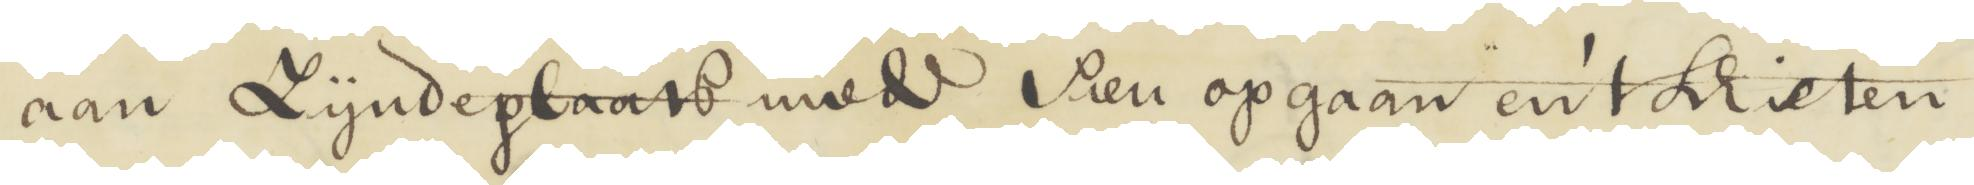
aan zijnde plaats mede sien op gaan en’t schieten
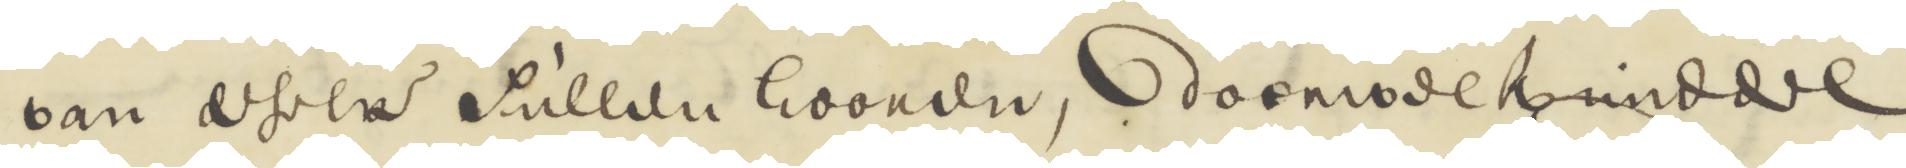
van deselve sullen hooren, door welk middel
